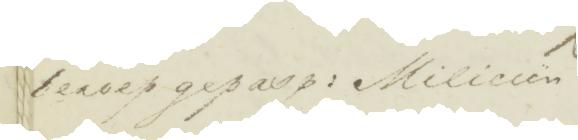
beroep gepasp: Miliciën
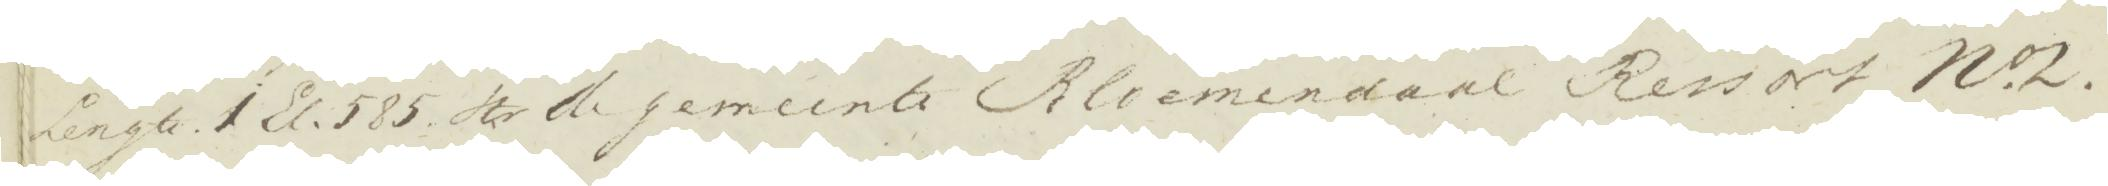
Lengte. 1 El. 585 Str de gemeente Bloemendaal Ressort N.o 2.
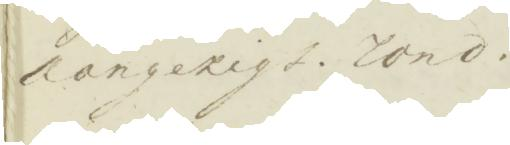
aangezigt. rond.
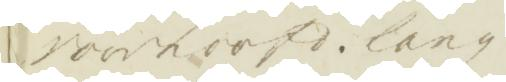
voor hoofd. lang
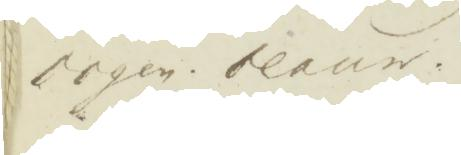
oogen blauw.
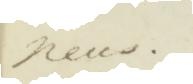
neus.
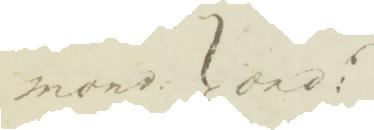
mond. ord:s
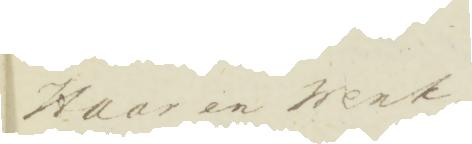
Haar en Wenk
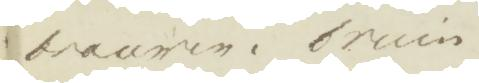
brauwen, bruin
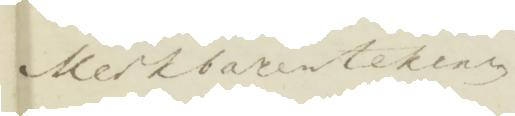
Merkbaren tekenen
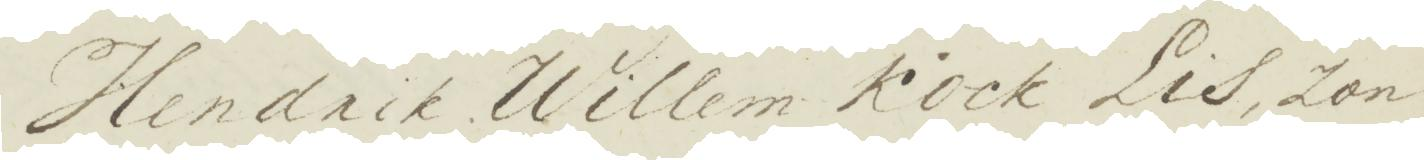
Hendrik Willem Kock Lis, zon
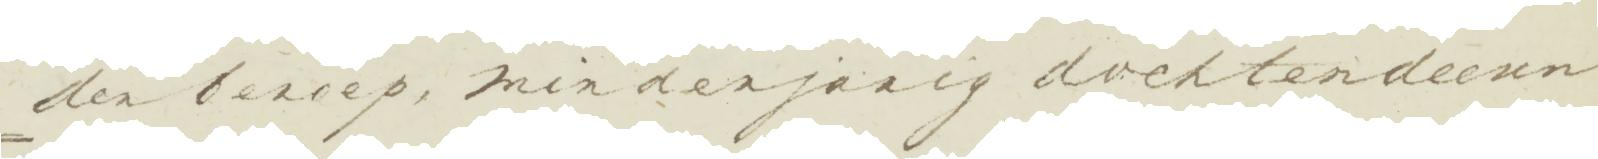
der beroep, minderjarig doch ten deesen
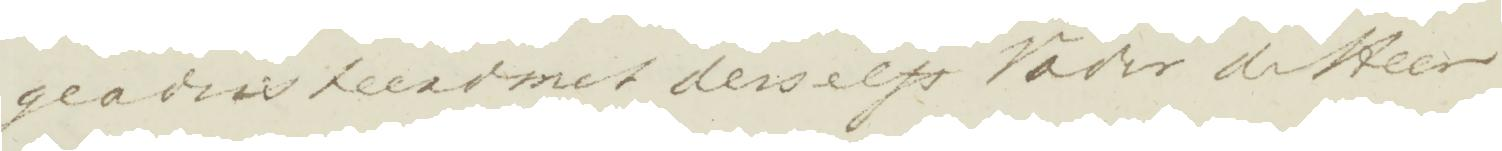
geadsisteerd met desselfs Vader de Heer
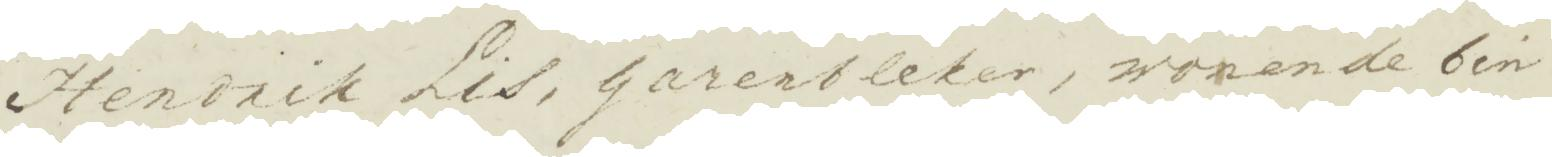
Hendrik Lis, garenbleker, wonende bin
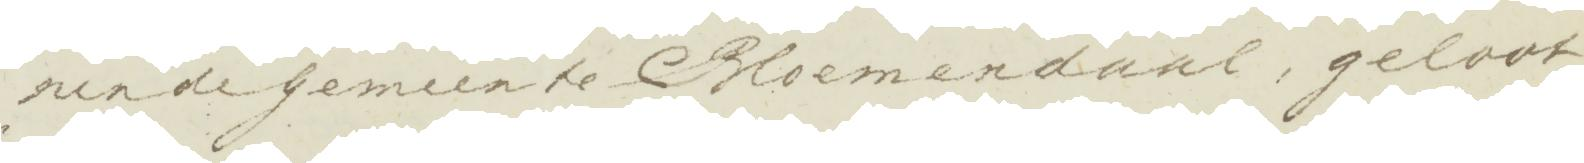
nen de gemeen te Bloemendaal, geloot
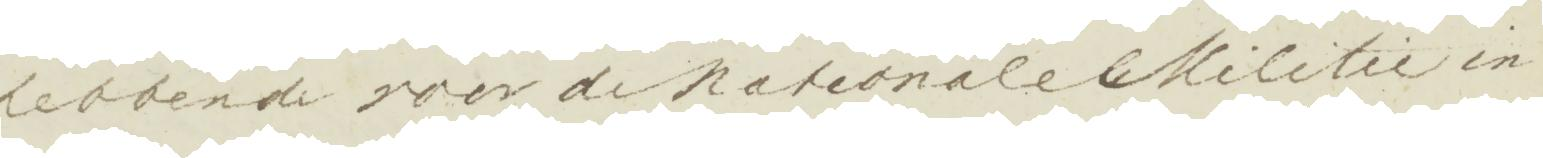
hebbende voor de Nationale Militie in
